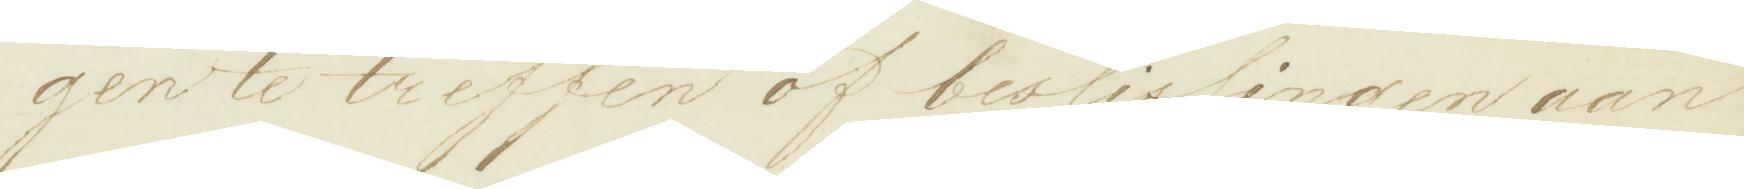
gen te treffen of beslissingen aan
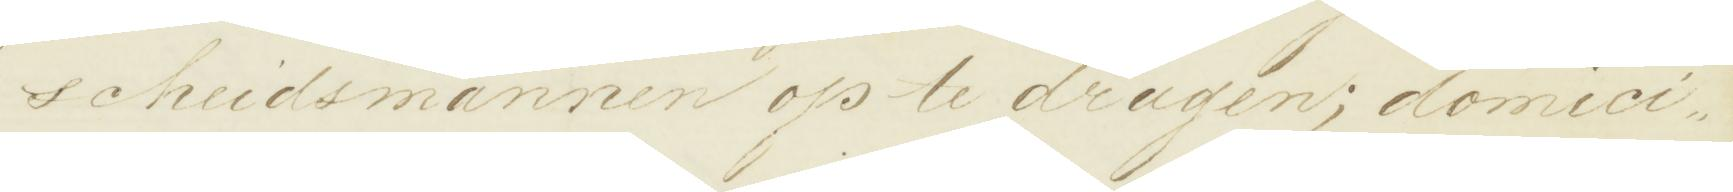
scheidsmannen op te dragen; domici„
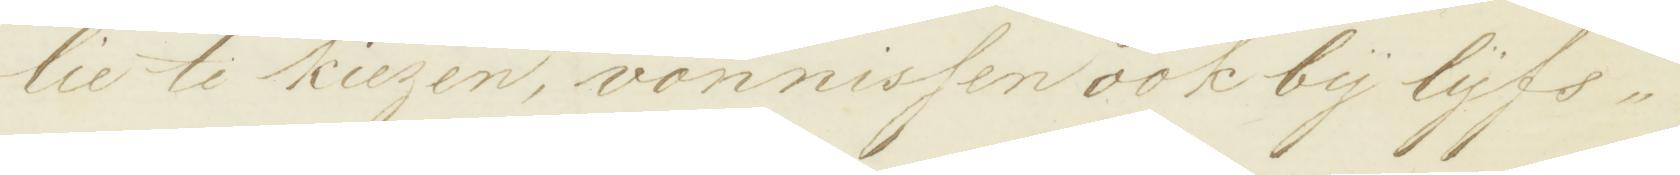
lie te kiezen, vonnissen ook bij lijfs„
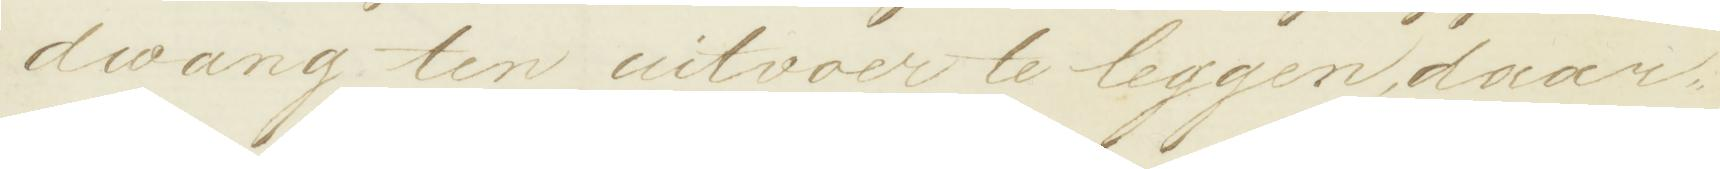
dwang ten uitvoer te leggen, daar„
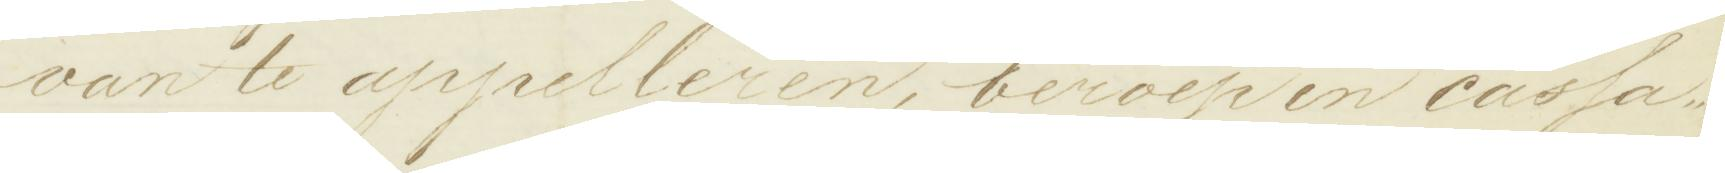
van te appelleren, beroep in cassa„
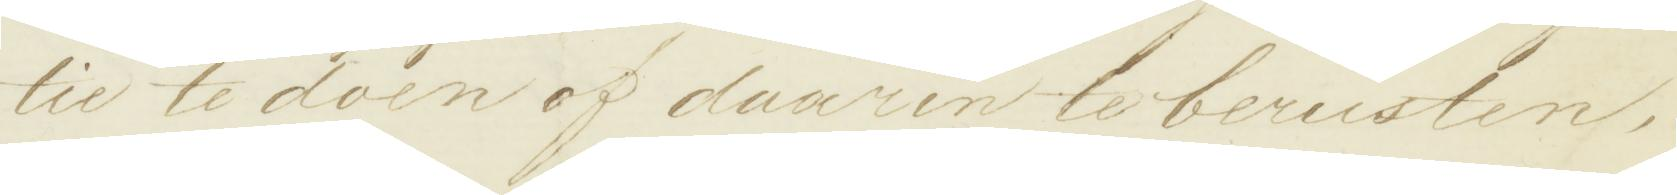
tie te doen of daarin te berusten,
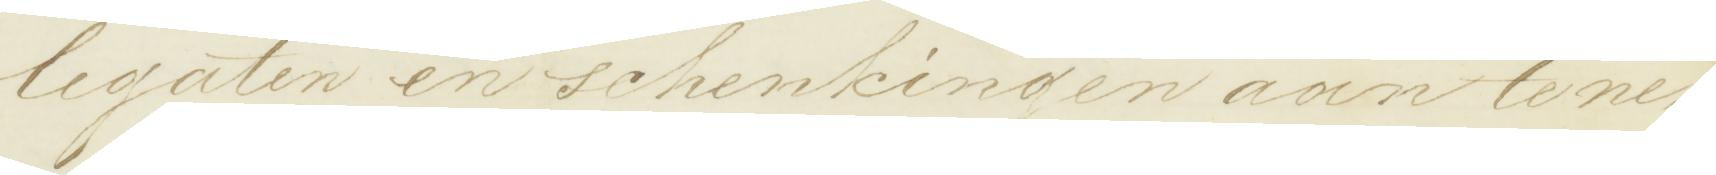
legaten en schenkingen aan te ne„
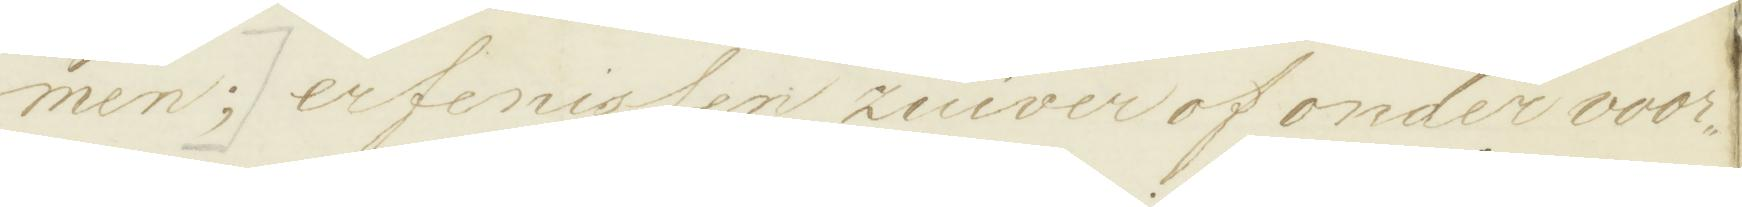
men: / erfenissen zuiver of onder voor„
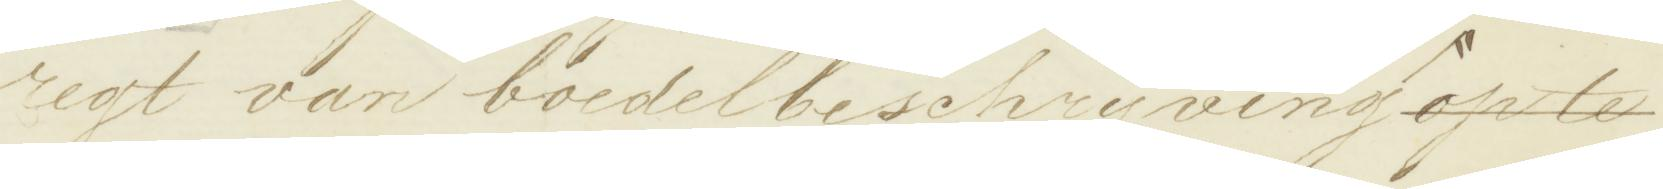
regt van boedelbeschrijving ¶ op te
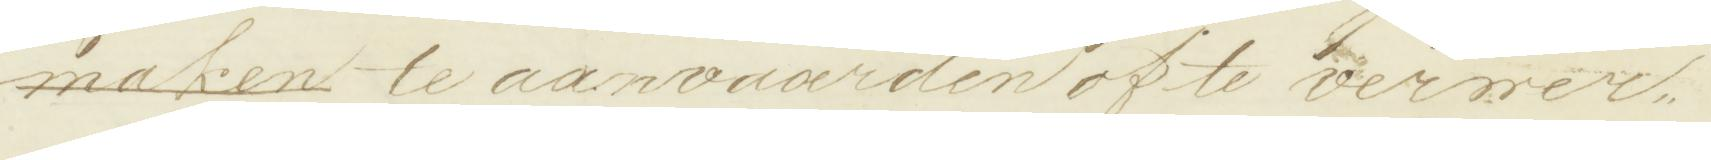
maken te aanvaarden of te verwer„
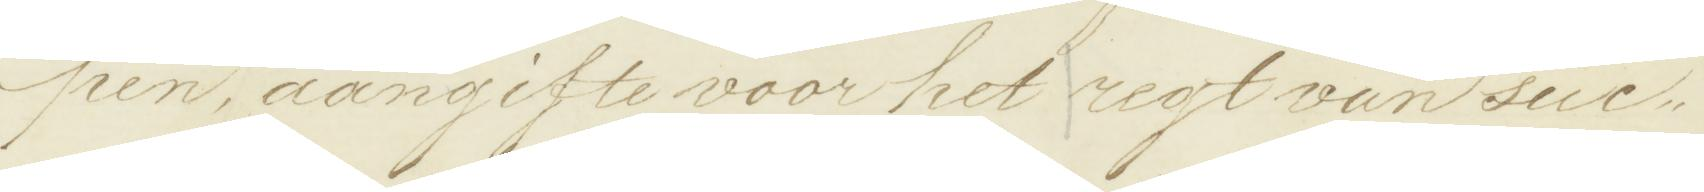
pen, aangifte voor het /regt van suc„
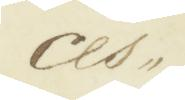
ces„
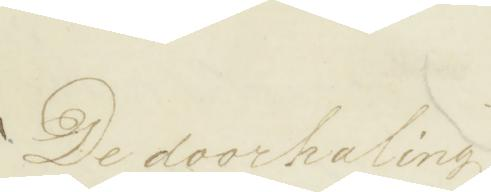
De doorhaling
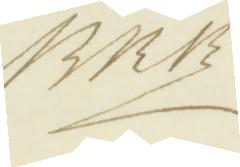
BRR
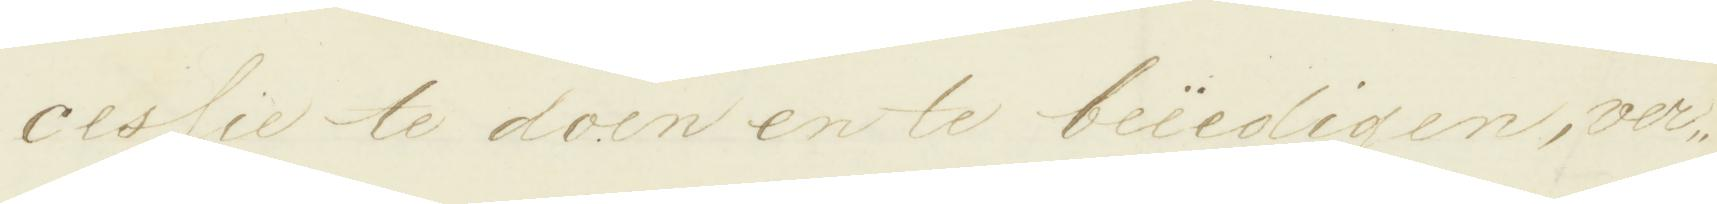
cessie te doen en te beëedigen, ver„
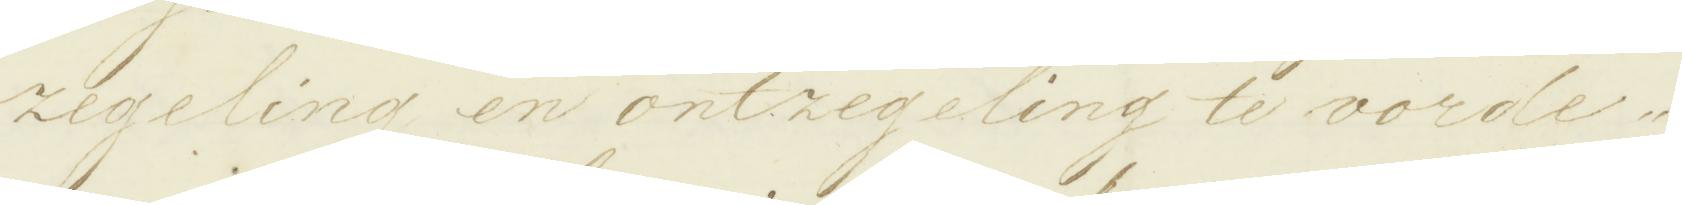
zegeling en ontzegeling te vorde„
